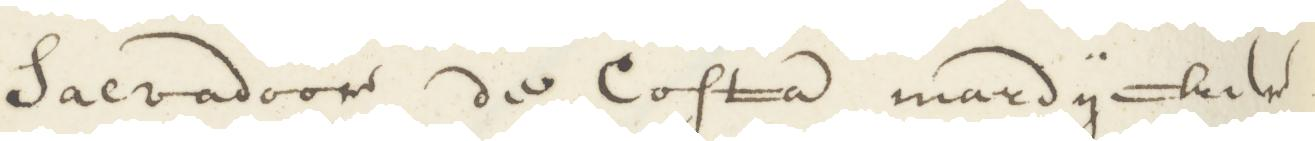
Salvadoor de Costa mardijcker
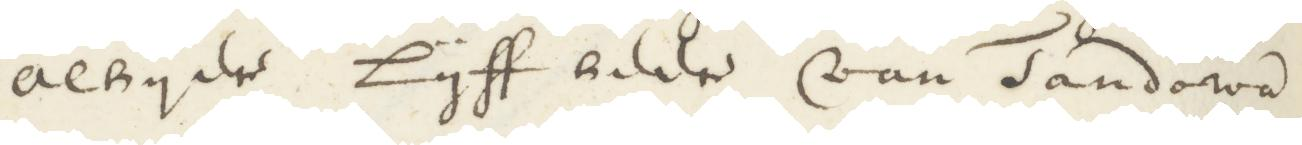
alhijer lijff heer van Tandowa
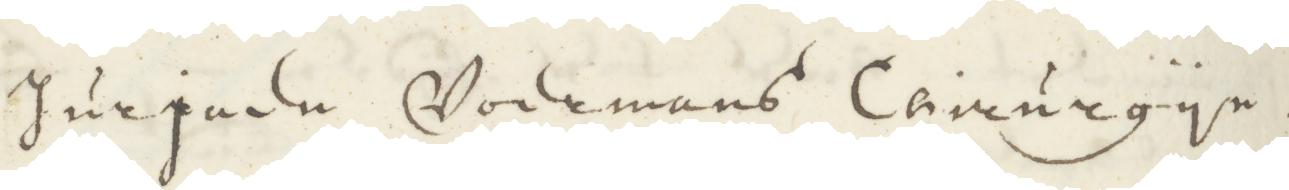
Jurjaen voermans Chirurgijn
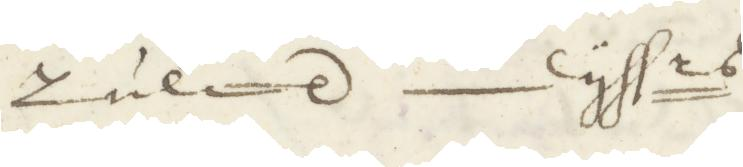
zulcx eijss=rs
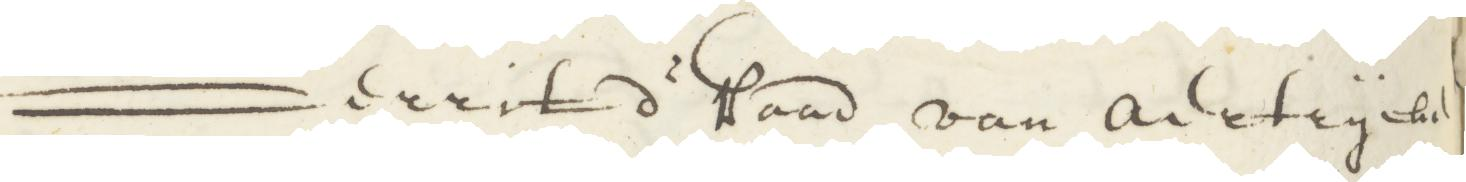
Gerrit d’ Raad van aertrijcke
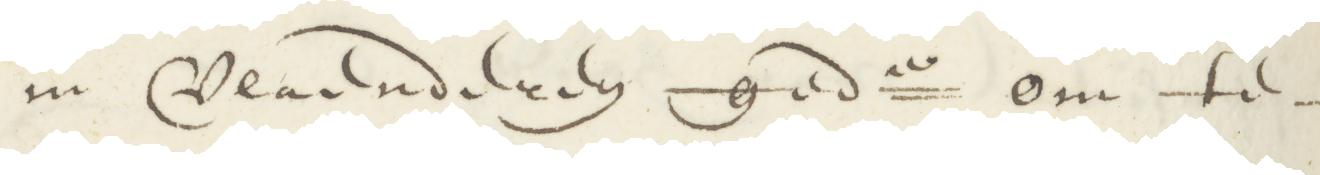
in Vlaenderen ged=e om te
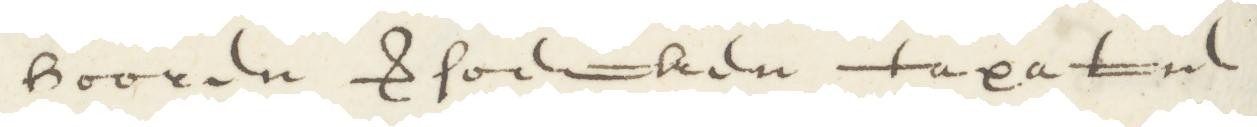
hooren versoecken taxatie
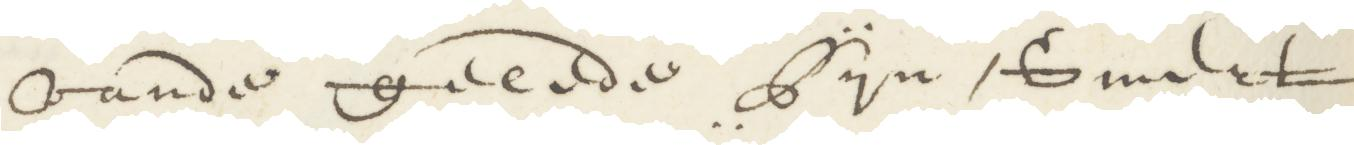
vande gelede Pijn, Smert
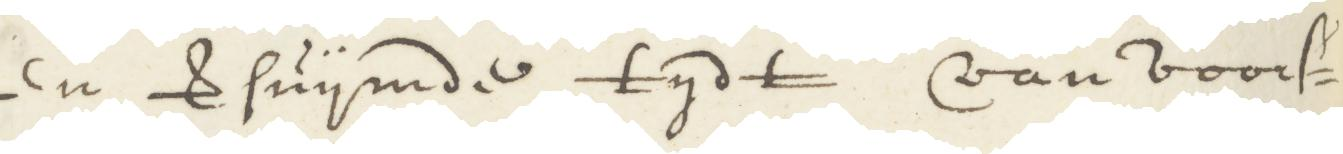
en versuijmde tijdt van voors=t
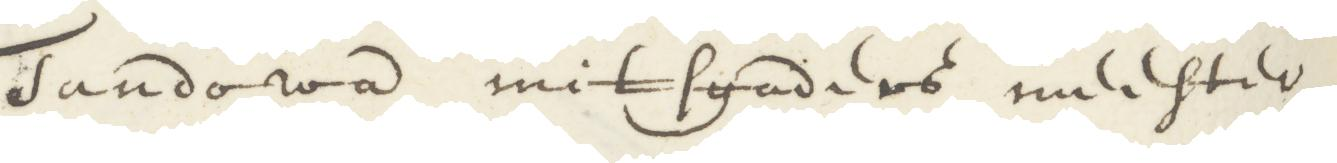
Tandowa mitsgaders meester
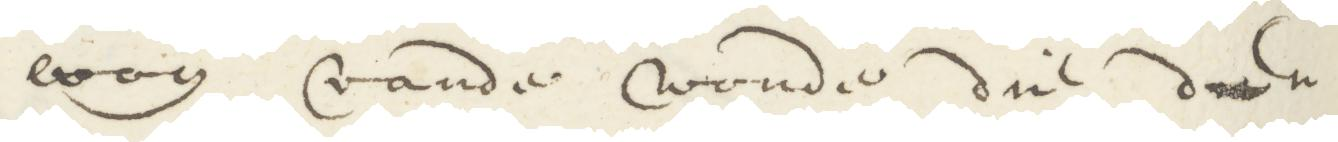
loon vande wende die den
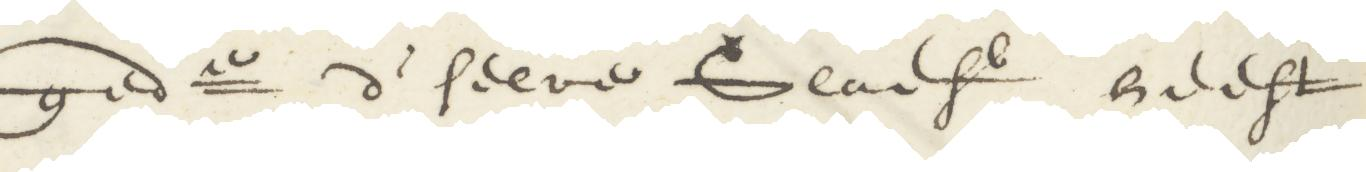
ged=e d’selve Slaef heeft
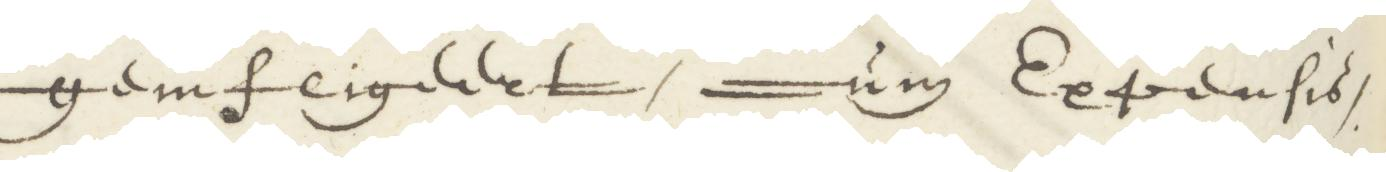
geinfligeert, cum Expensis/.
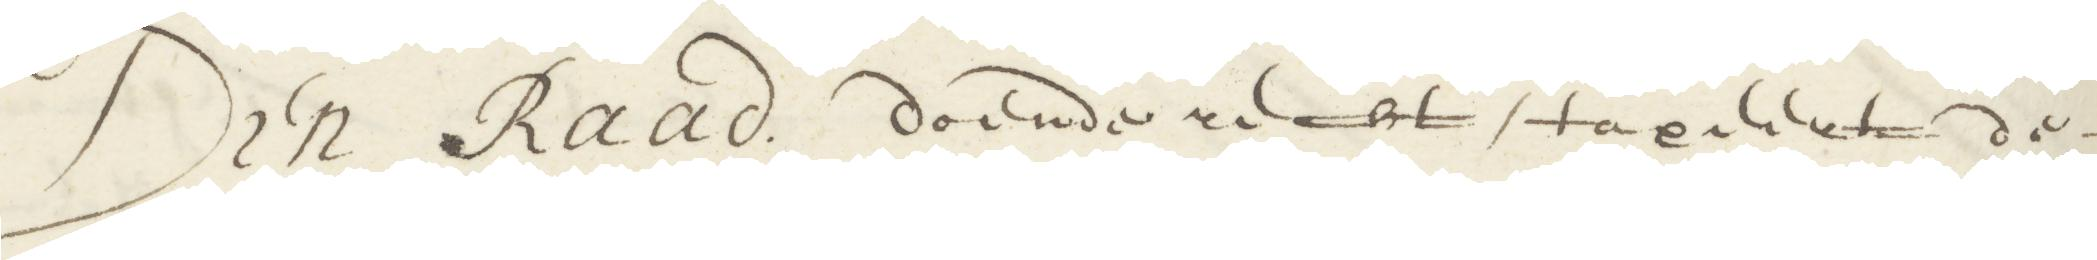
Den Raad. doende recht / taxeert de
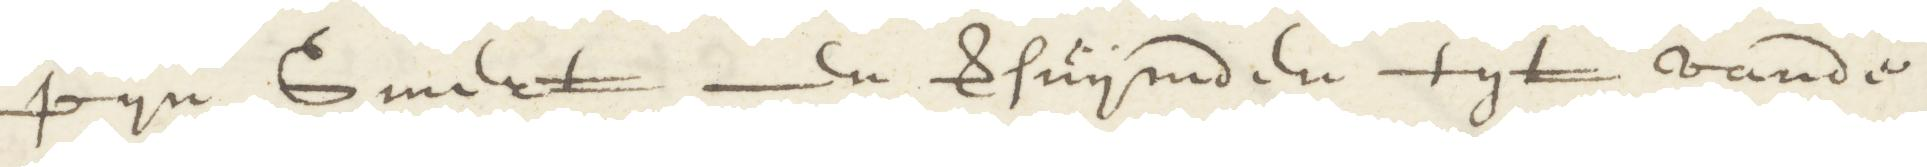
pijn Smert en versuijmden tijt vande
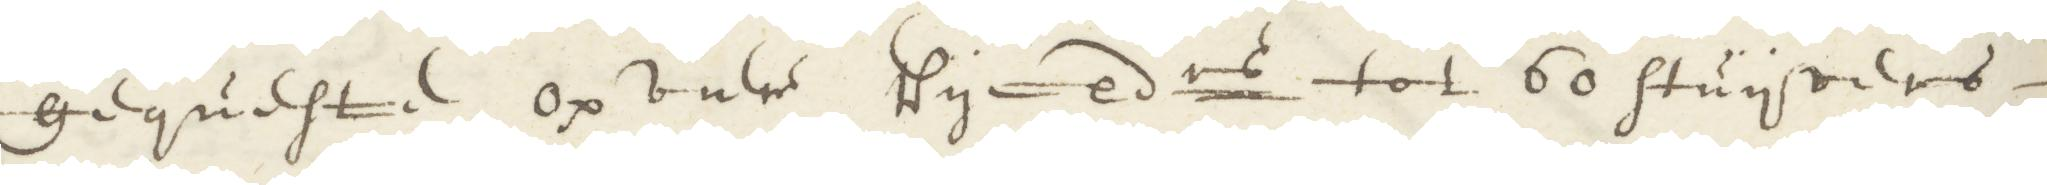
gequeste op vier Rijcxd=rs tot 60 stuijvers —
